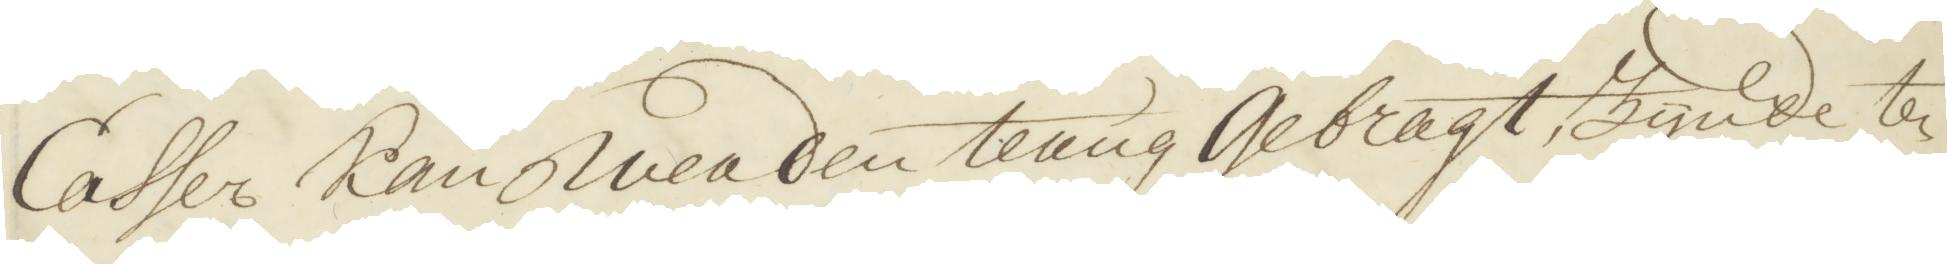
casser kan werden terug gebragt, zijnde ten
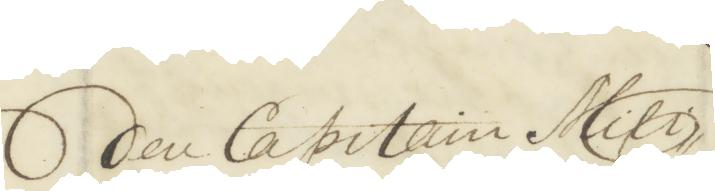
den Capitain Mili„
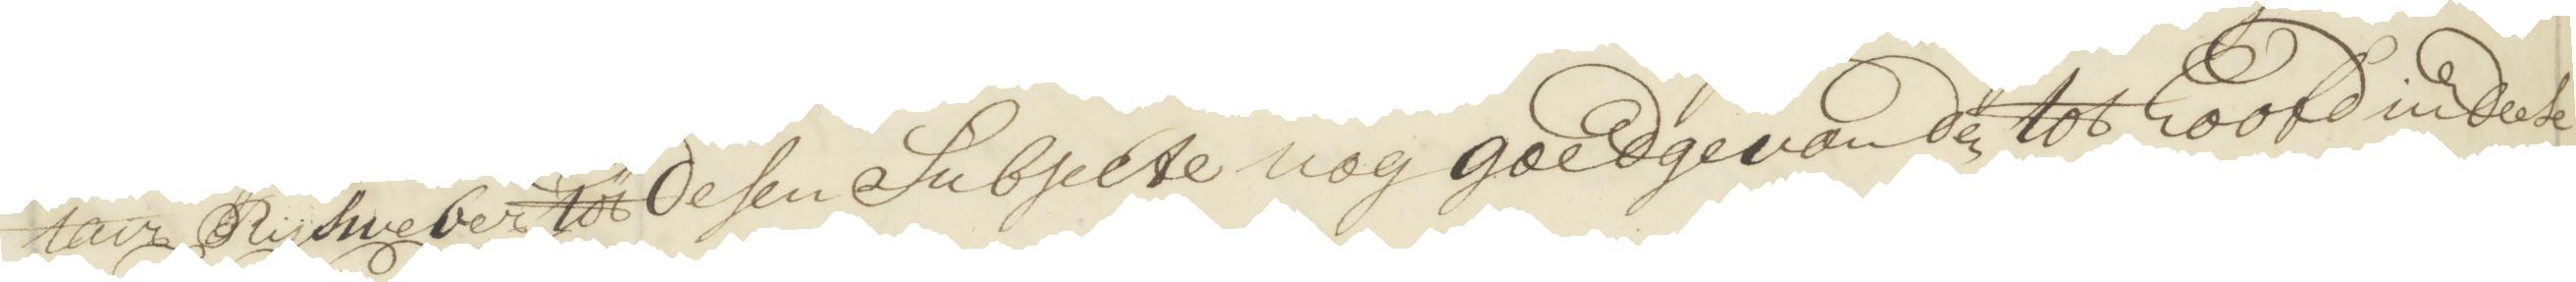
tair Rijsweber tot desen subjecte nog goedgevonden tot hoofd in deese
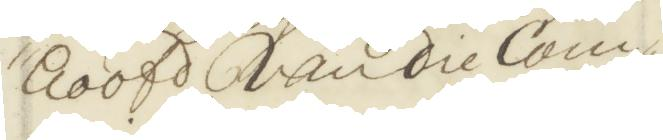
hoofd van die com
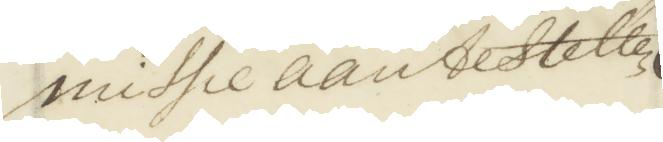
missie aan te stellen
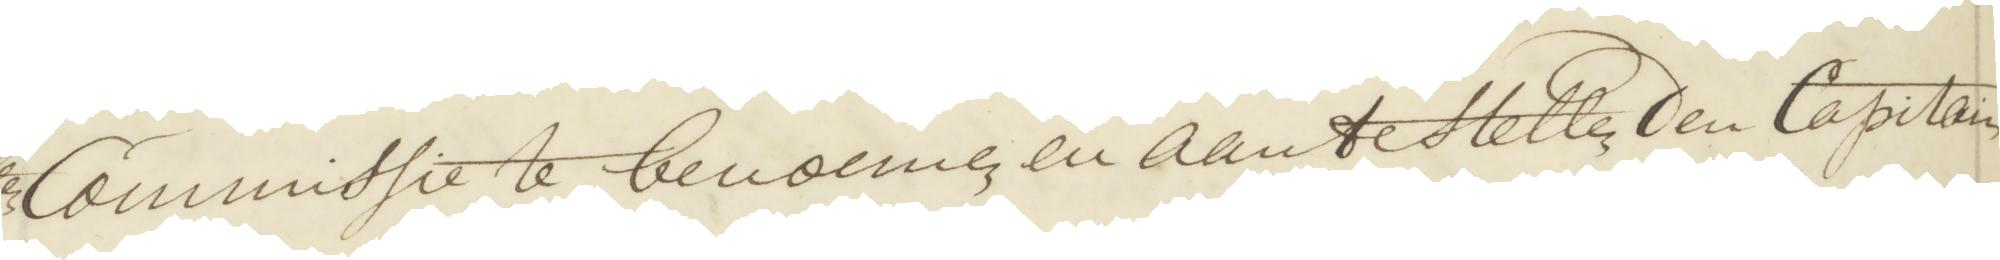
commissie te benoemen en aan te stellen den capitain
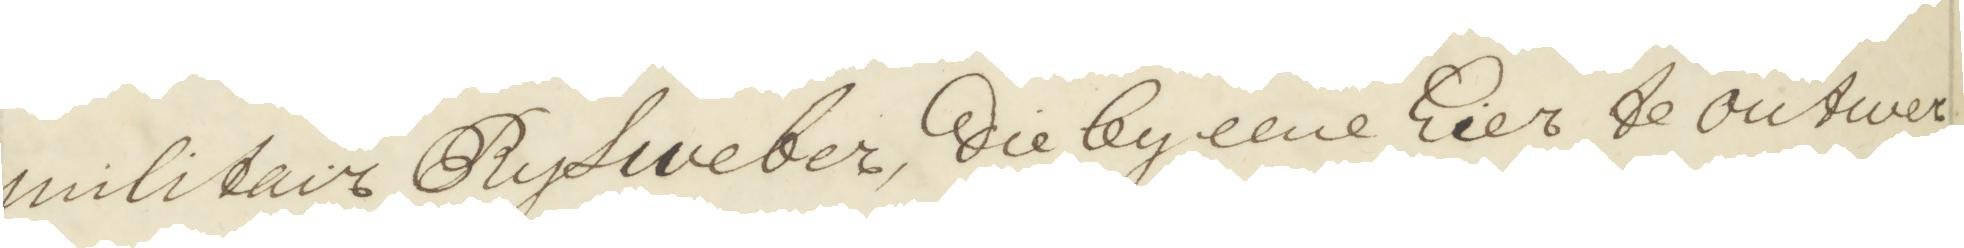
militair Rysweber, die by eene hier te ontwer
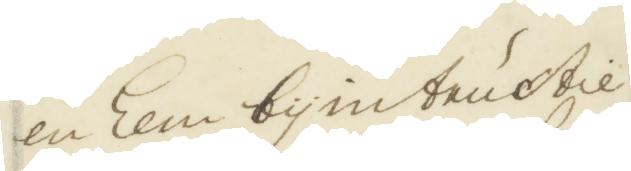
en hem bij intructie
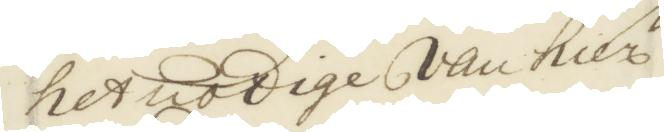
het nodige van hier
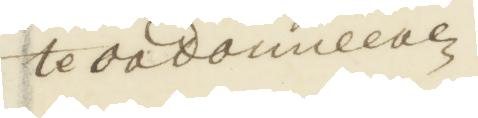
te ordonneeren
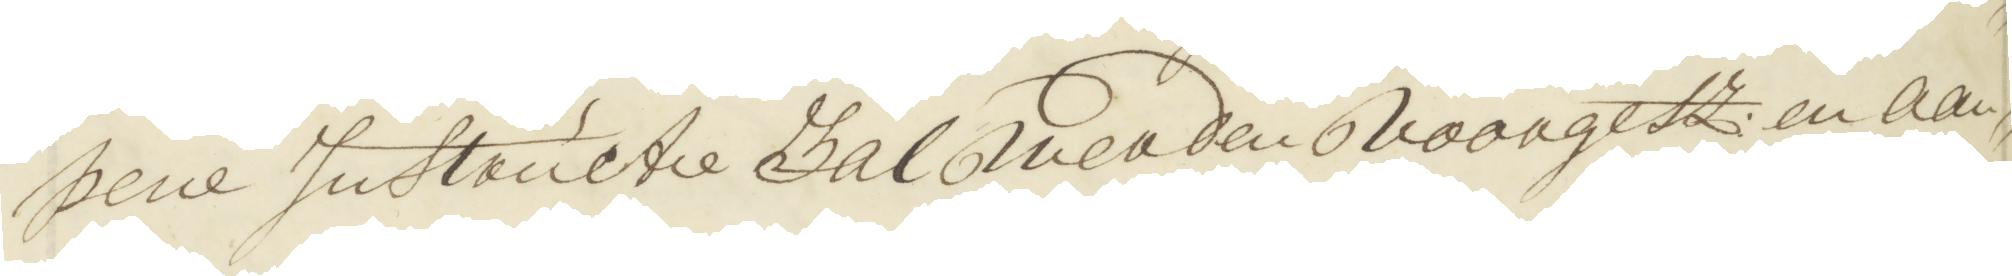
pene Instructie zal werden voorgesz: en aan„
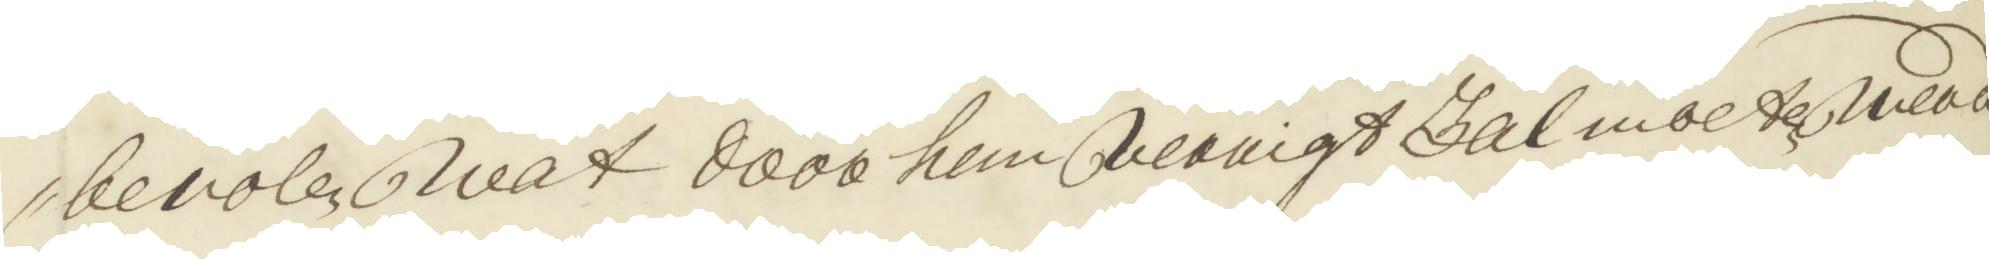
„bevolen wat door hem verrigt zal moeten werd
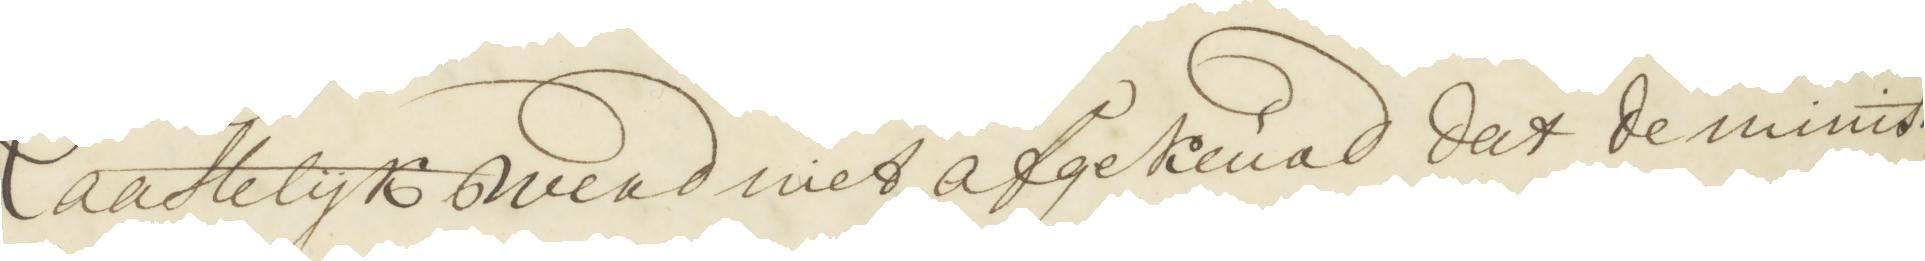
Laastelijk werd niet afgekeurd dat de minis
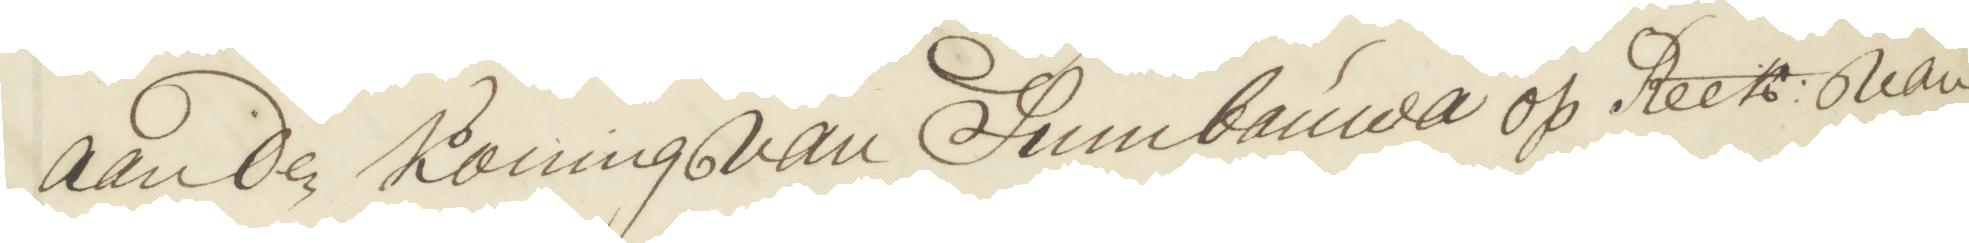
aan den koning van Sumbauwa op Reets: van
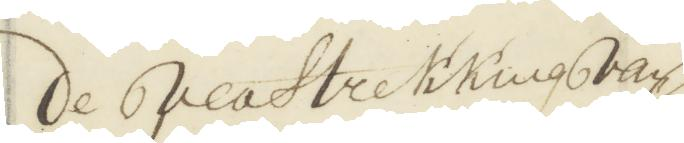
de vlastrekking van
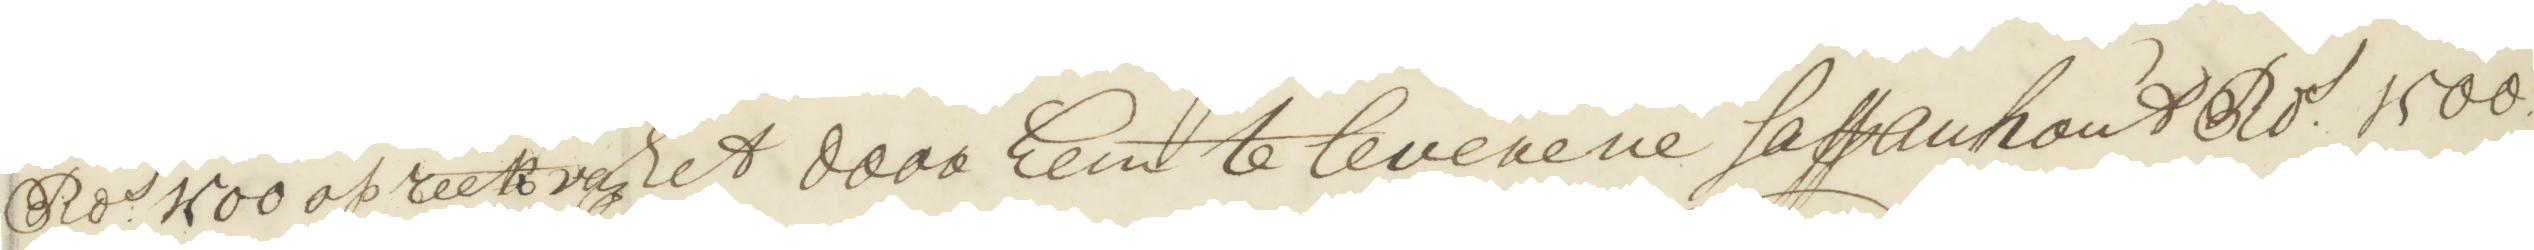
Rd:s 1500 op reek van het door hem te leverene sappanhout Rd.s 1500:
